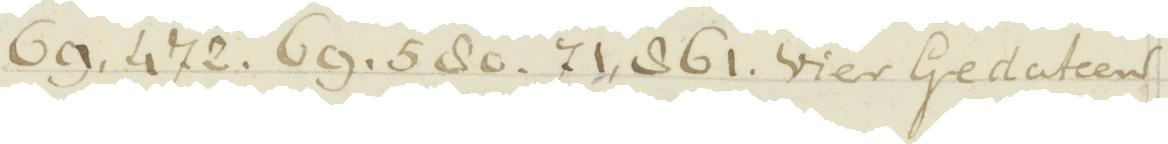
69,472, 69,580, 71,861. Vier Gedateerd
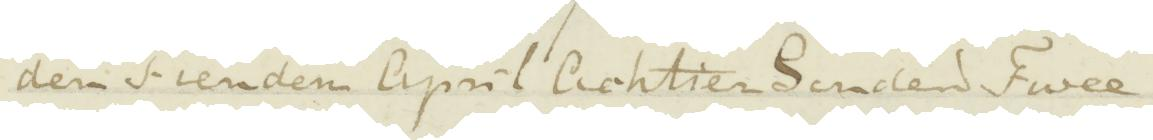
den Tienden April Achtien Honderd Twee
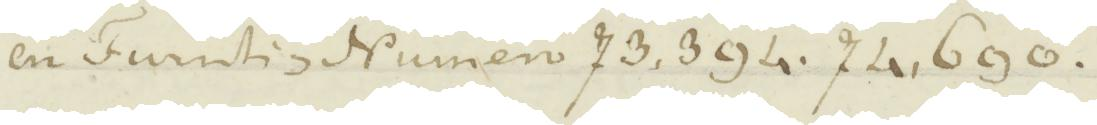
en Twintig Numero 73,394, 74,690,
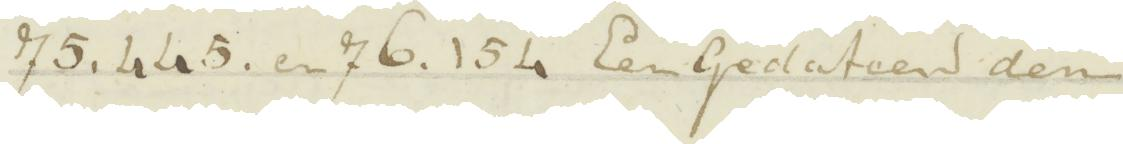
75,445, en 76,154 Een Gedateerd den
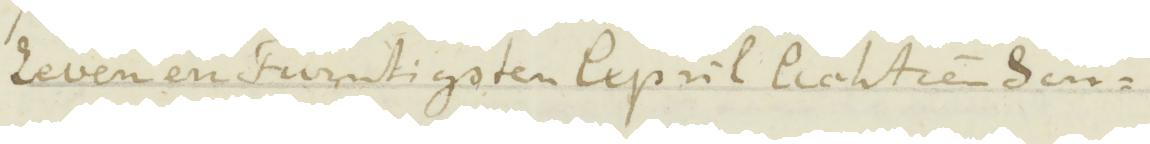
zeven en Twintigsten April Achtien hon„
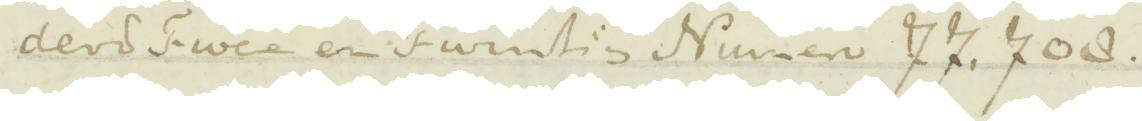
derd Twee en Twintig Numero 77,708.
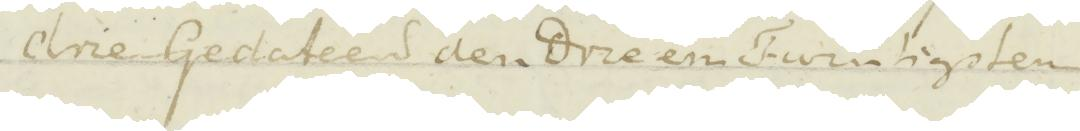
Drie Gedateerd den Drie en Twintigsten
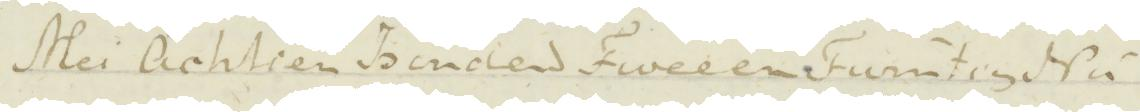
Mei Achtien Honderd Twee en Twintig Nu
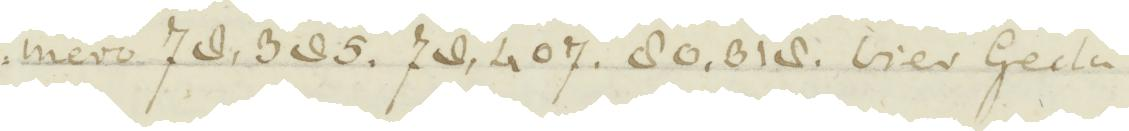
„mero 78,385, 78,407, 80,318. Vier Geda
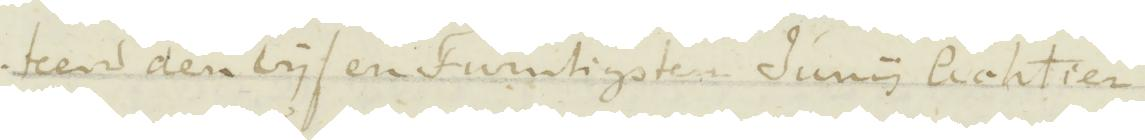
„teerd den Vijf en Twintigsten Iunij Achtien
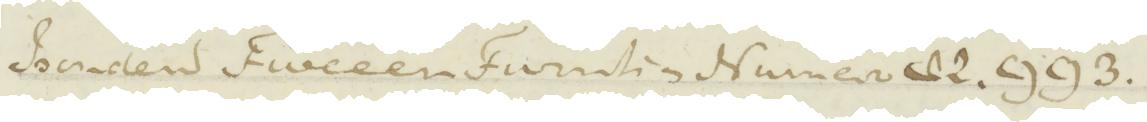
Honderd Twee en Twintig Numero 82,993,
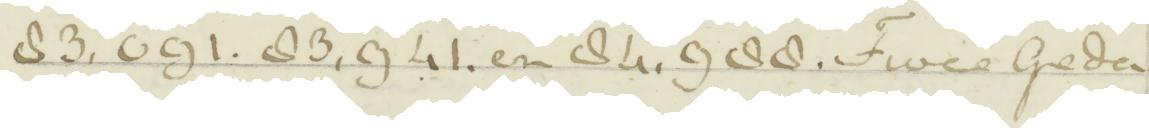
83,091, 83.941, en 84,988. Twee Geda
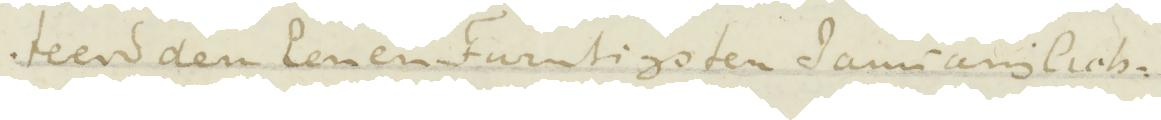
„teerd den Een en Twintigsten Ianuarij Ach„
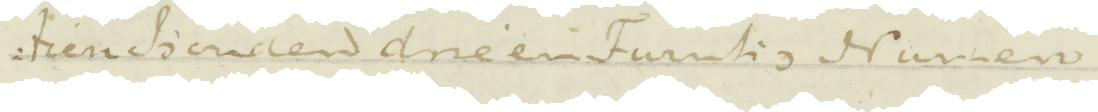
„tien honderd drie en Twintig Numero
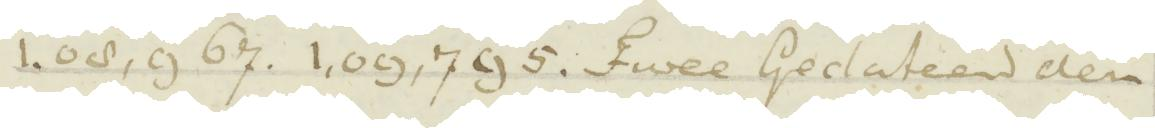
1,08,967, 1,09,795. Twee Gedateerd den
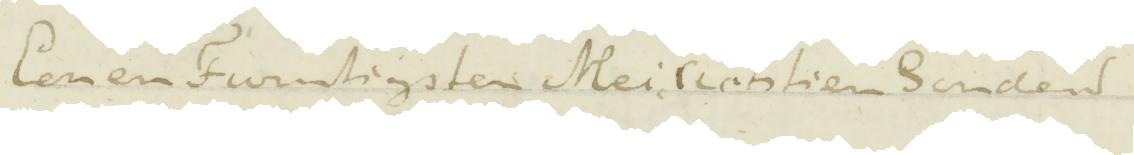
Een en Twintigsten Mei Achtien honderd
